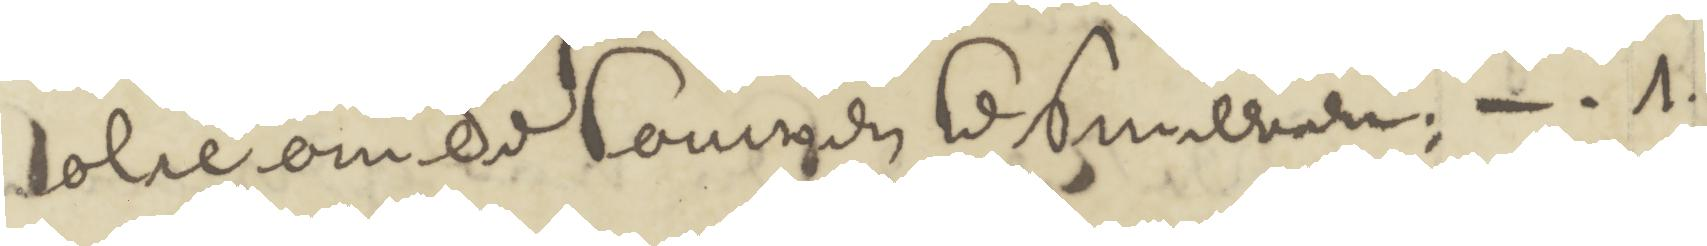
olie om de touwen te smeeren; —. 1
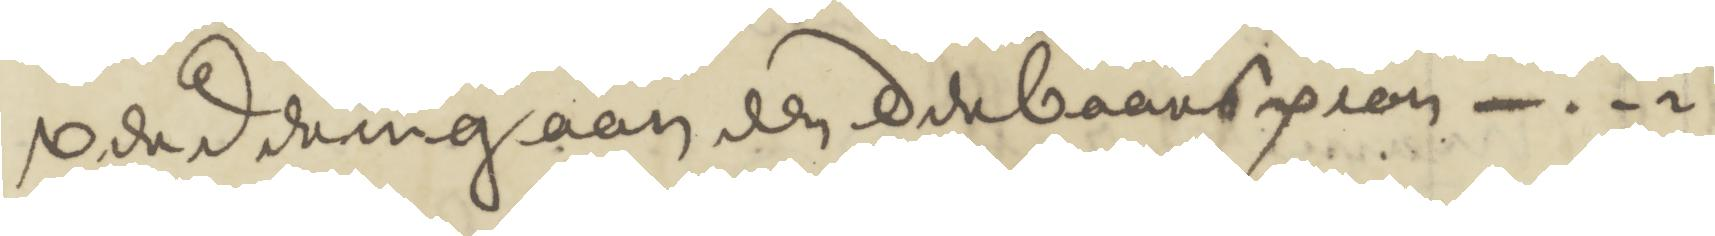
ver Eering aan een der baars pion —. - ½
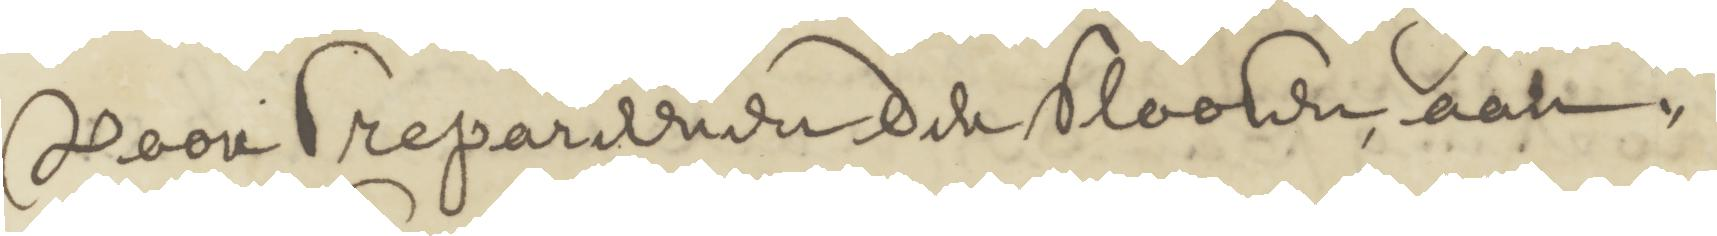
Voor t repareeren der slooten, aan „
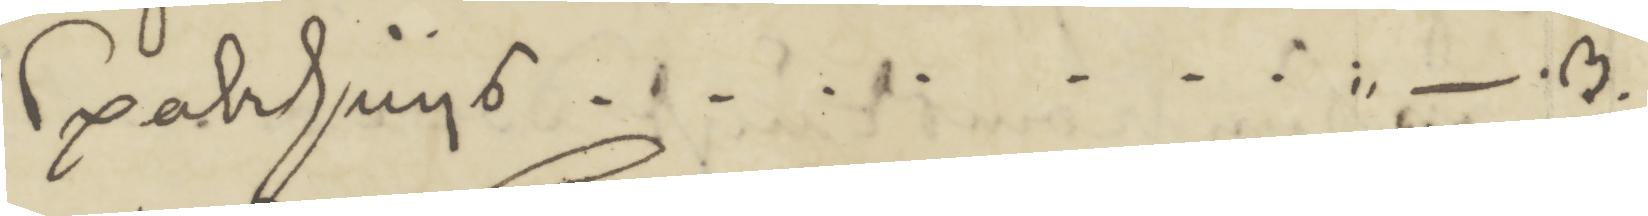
t pakhuijs - - - - - - - „ —. 3.
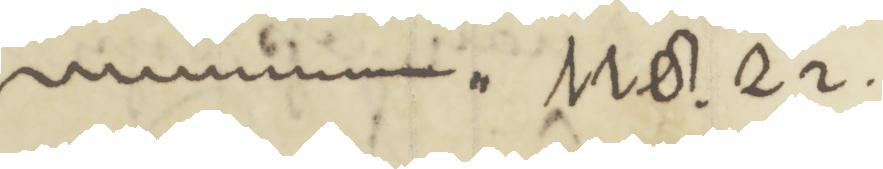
118.2½
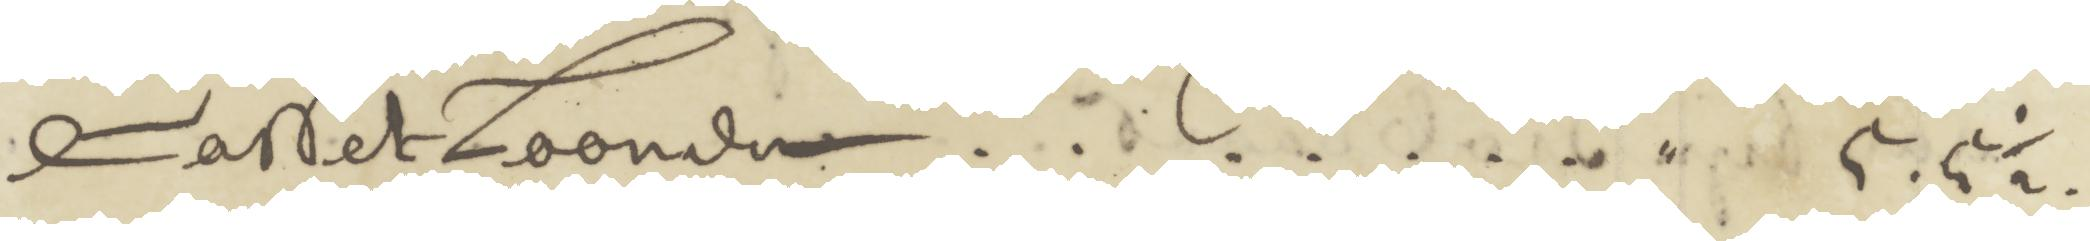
Casset Loonen - - - - - - - „ 5. 5½.
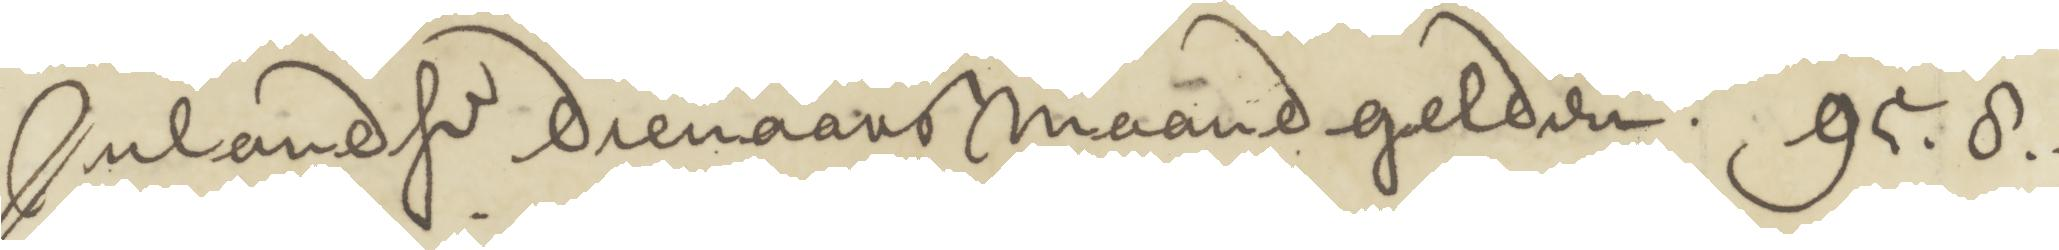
Jnlandse, dienaars maand gelden - 95. 8.
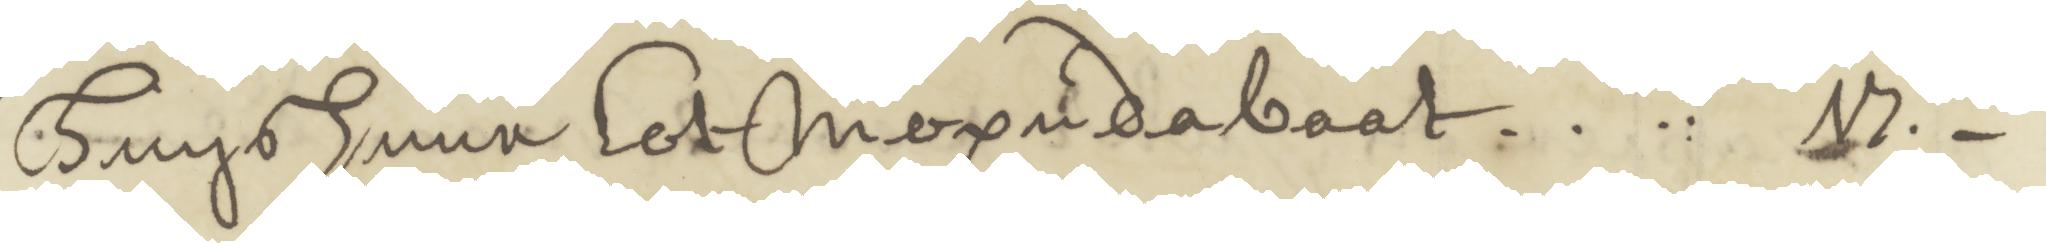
Huys huur tot Moxudabaat - - - „ 17. —
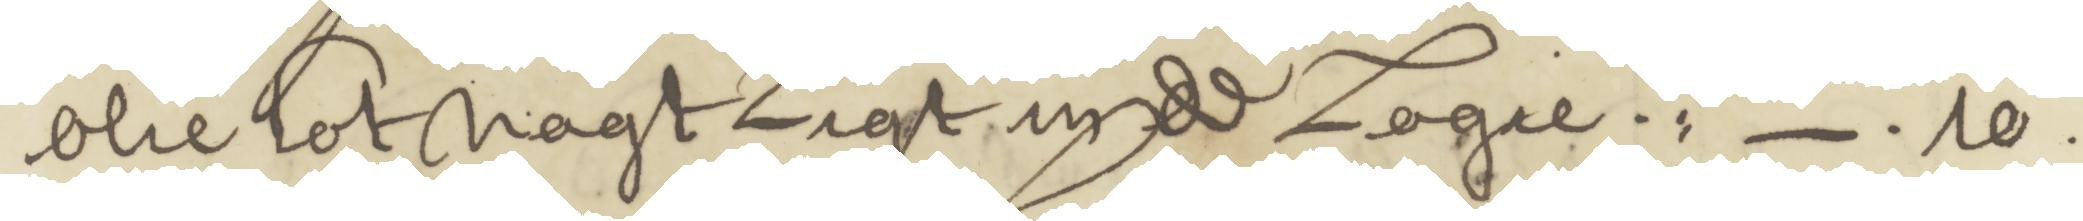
olie tot nagt Ligt in de Logie - „ —. 10
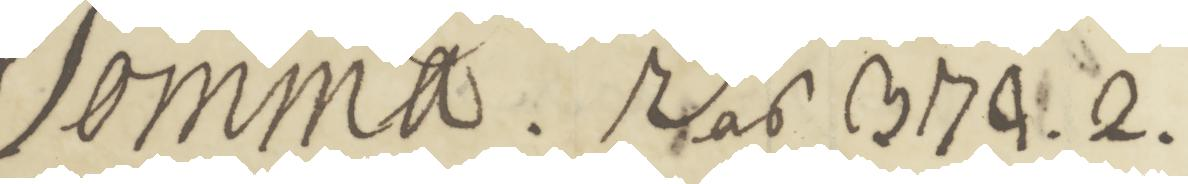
Somma. Roas 374. 2.
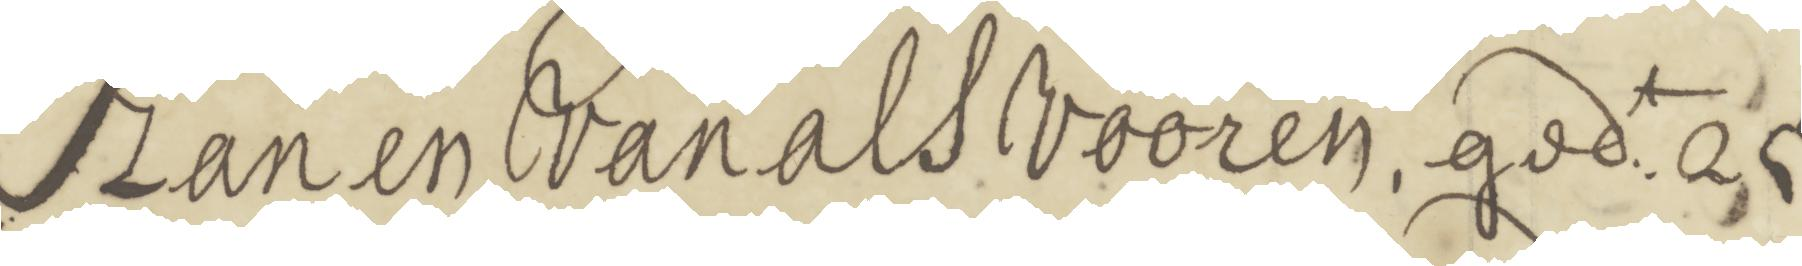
Aan en Van als Vooren, ged:t 25
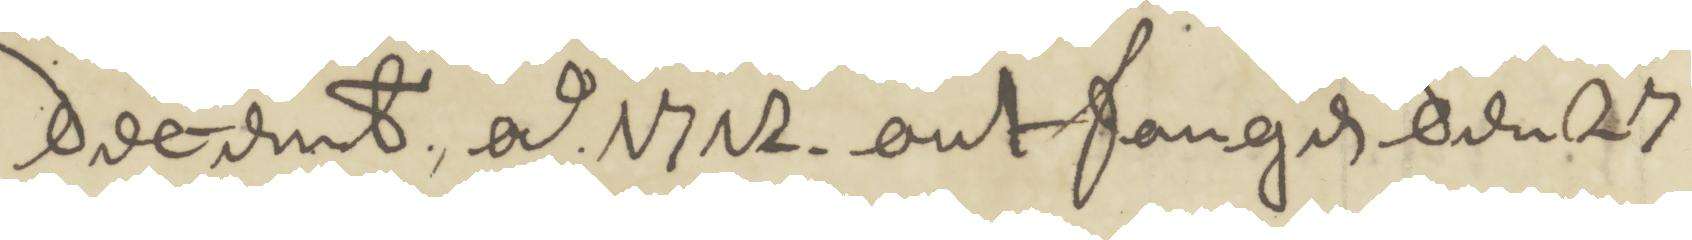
decemb., a.o 1712. ontfangen den 27
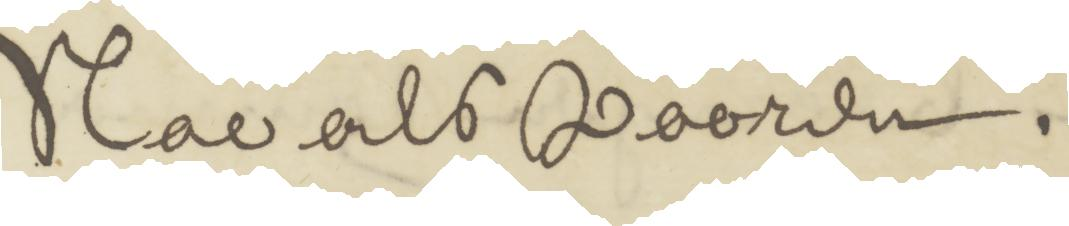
Nae als Vooren.
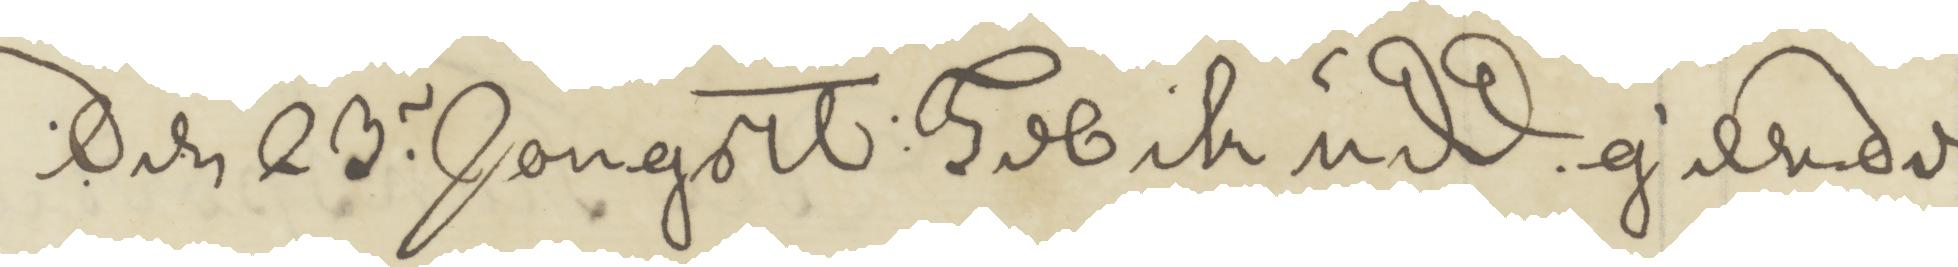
den 23:' Jongstl: heb ik uEE: g’eerde
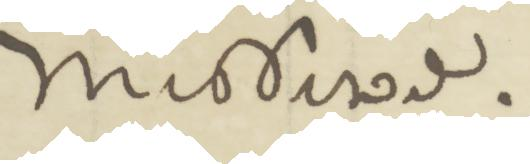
missive.
